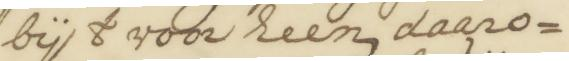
bij t voor heen daaro=
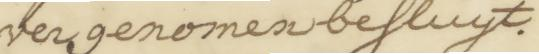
ver genomen besluijt.
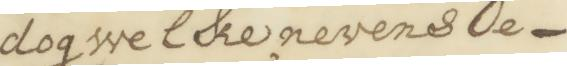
dog welke nevens de —
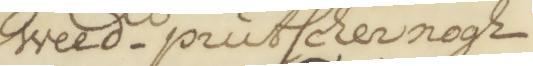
welE-n prutscher nogh
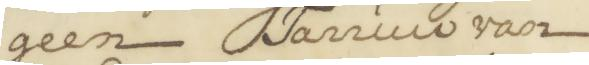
geen Tarruw voor
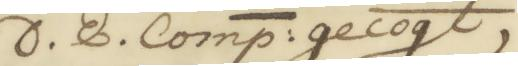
d. E. Comp: gecogt,
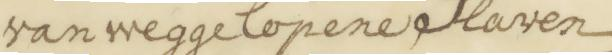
van weggelopene slaven
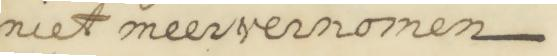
niet meer vernomen
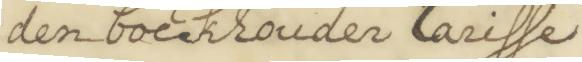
den boekhouder Larisse
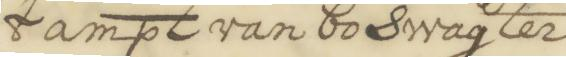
t ampt van boswagter
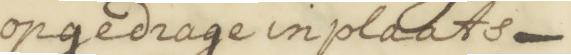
opgedrage in plaats —
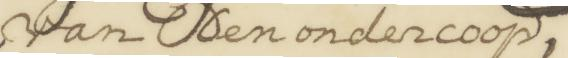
van den ondercoop,
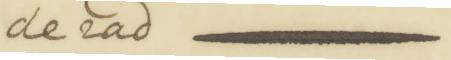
de rad —
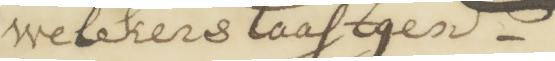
welkers laastgen-
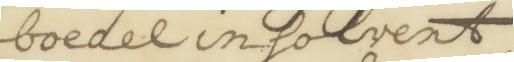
boedel insolvert
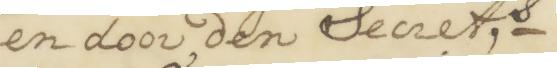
en door den Secret,-s
